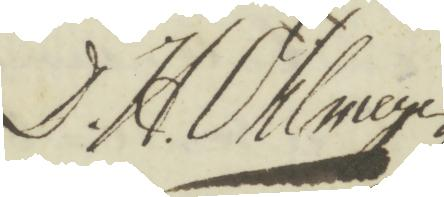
D. H: Ohlmeye
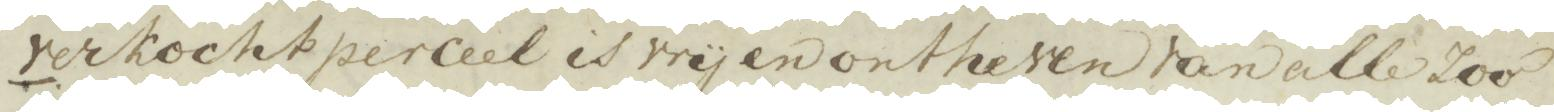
verkocht perceel is vrij en ontheven van alle zoo
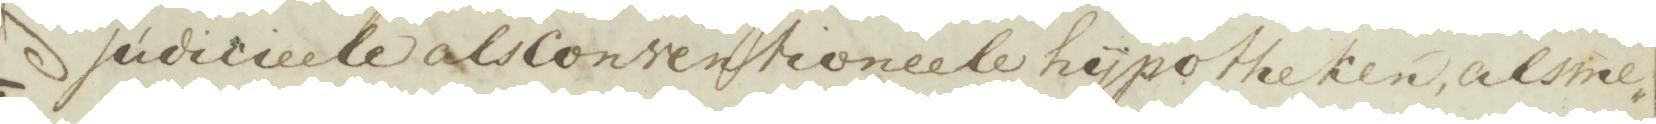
judicieele als conventioneele hijpotheken, alsme„
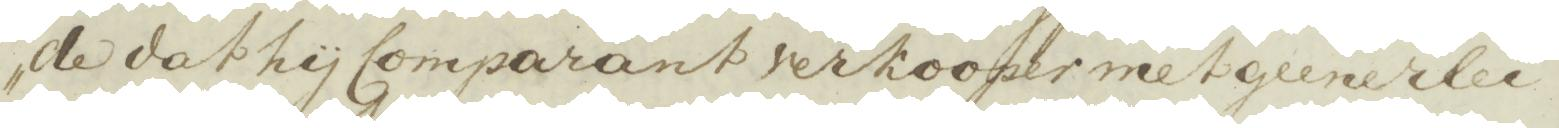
„de dat hij Comparant verkooper met geenerlei
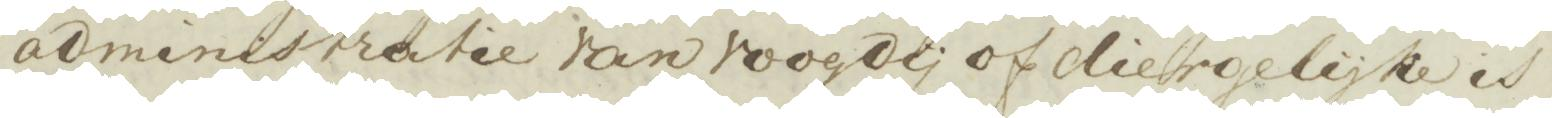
administratie van voogdij of diergelijke is
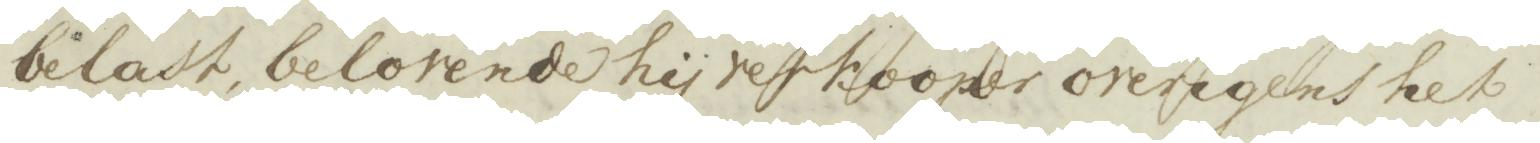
belast, belovende hij verkooper overigens het
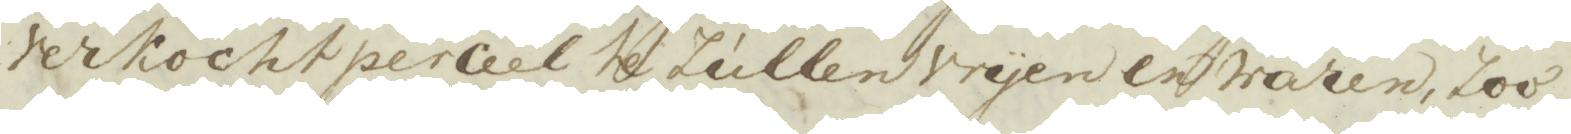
verkocht perceel te zullen vrijen en waren, zoo
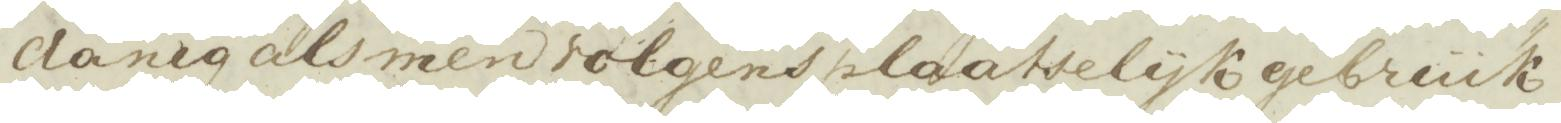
danig als men volgens plaatselijk gebruik
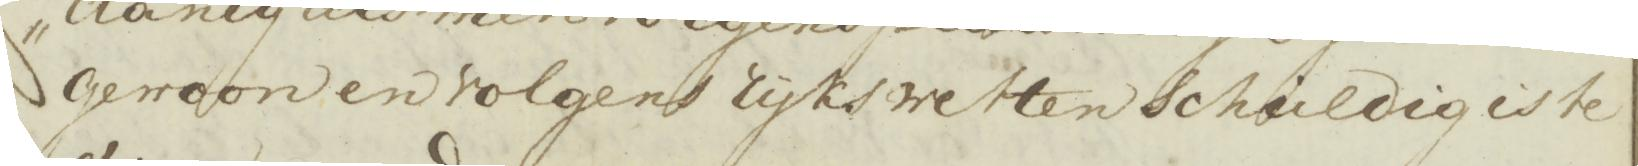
gewoon en volgens rijkswetten schuldig is te
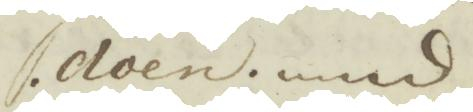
. doen.
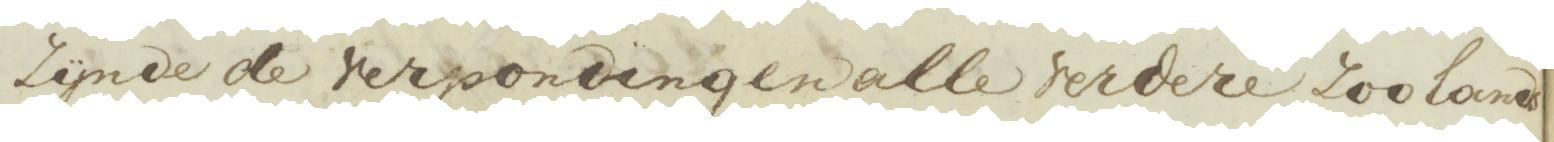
Zijnde de verpondingen alle verdere zoo lands
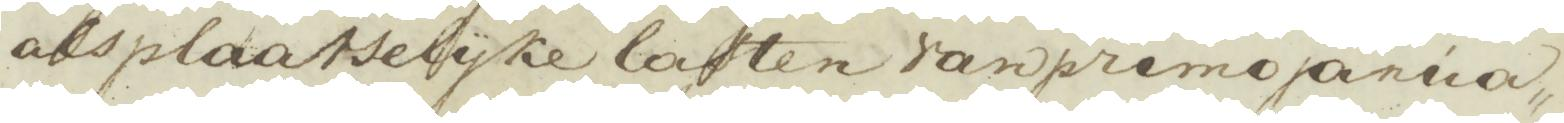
als plaatselijke lasten van primo janua„
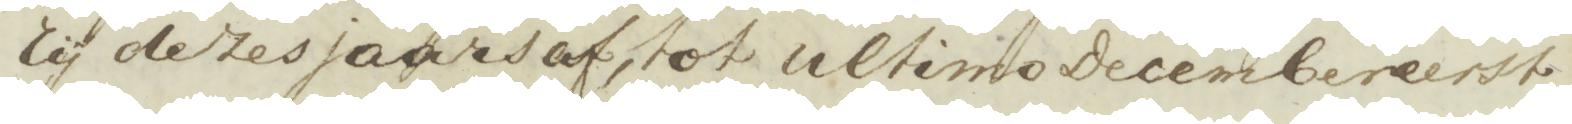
rij dezes jaars af, tot ultimo December eerst
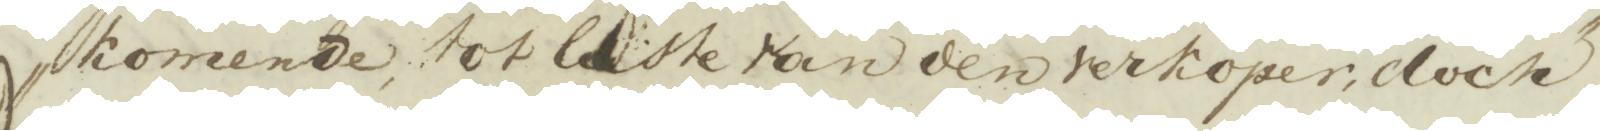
„komende, tot laste van den verkoper, doch
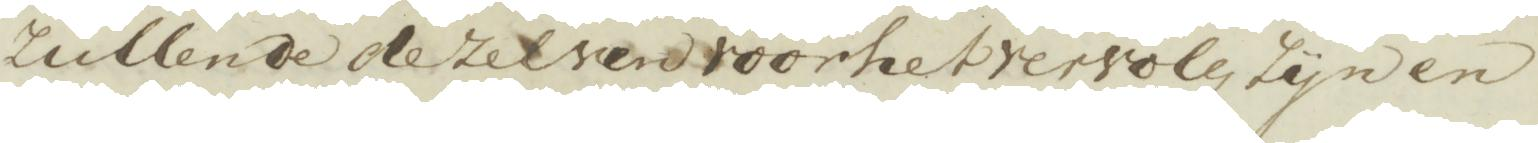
zullende de zelven voor het vervolg zijn en
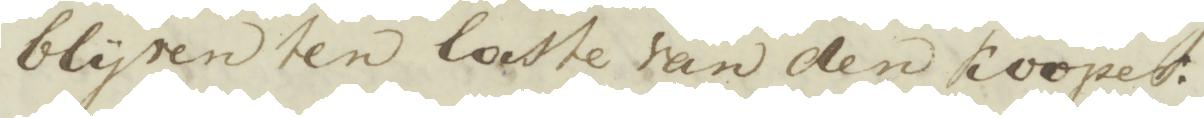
blijven ten laste van den kooper.
